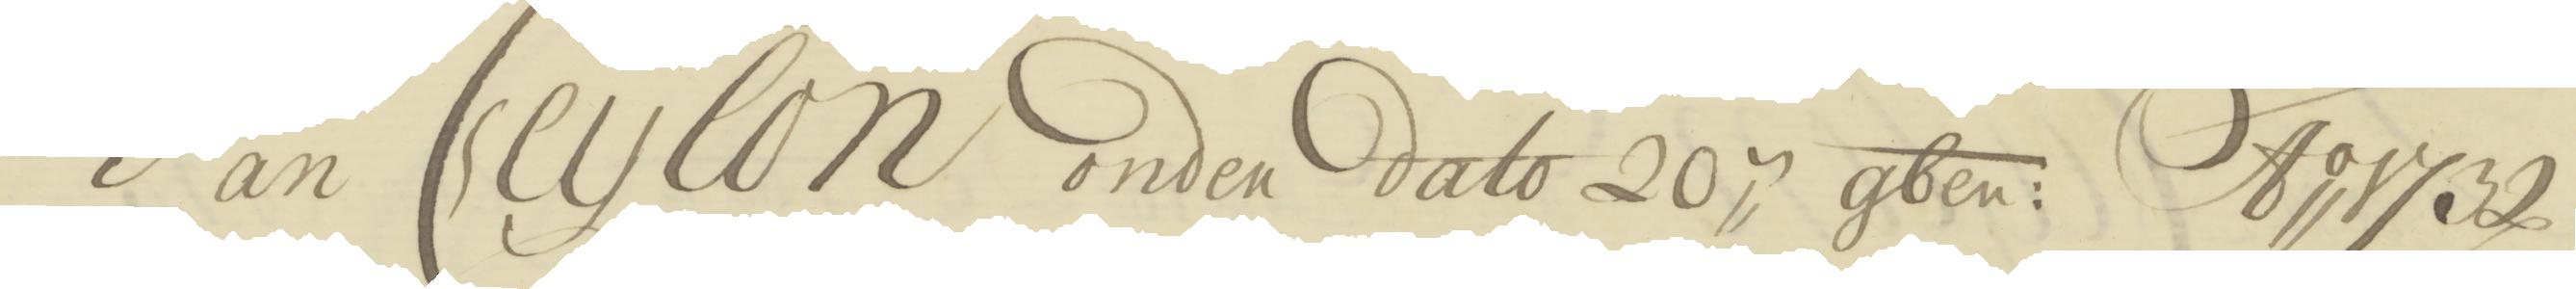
Van Ceylon onder dato 20„en gber: A„o 1732
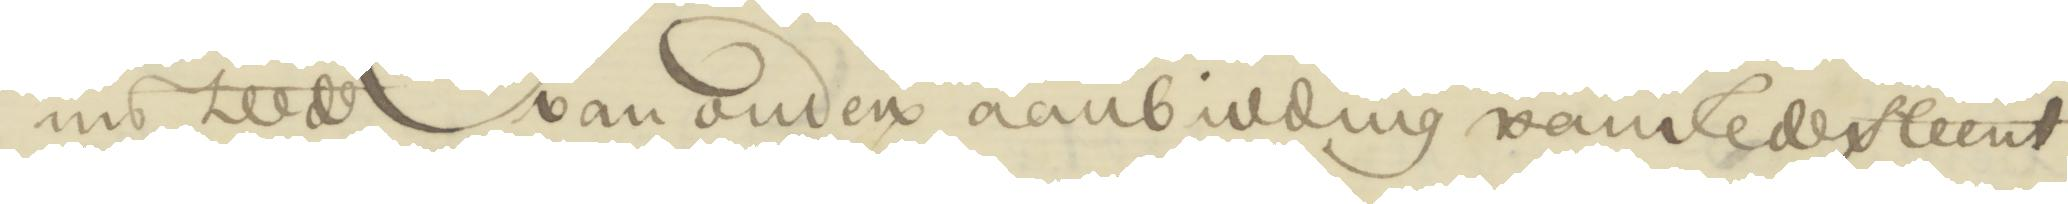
insteede van onder aanbieding van Eede verleent
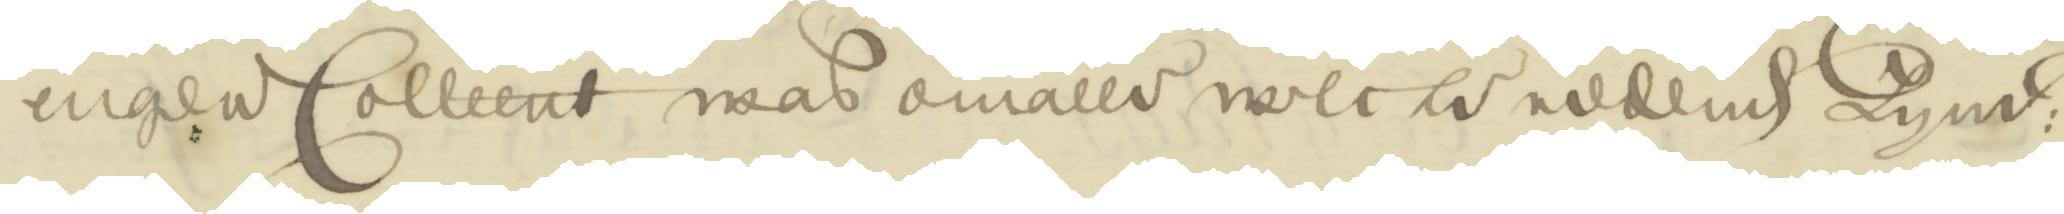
en gerecolleert was om alle welcke redenen Zyn E:
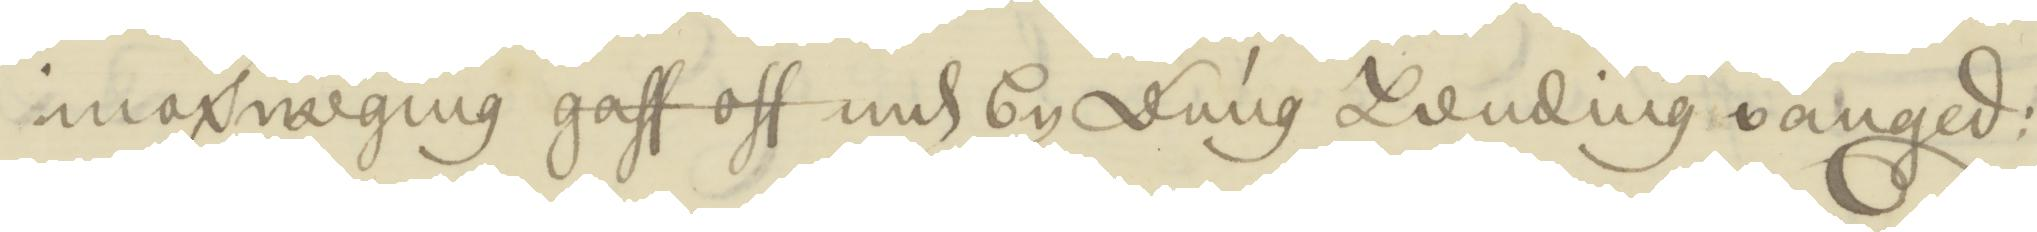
in overweging gaff off men by terug Zending van ged:
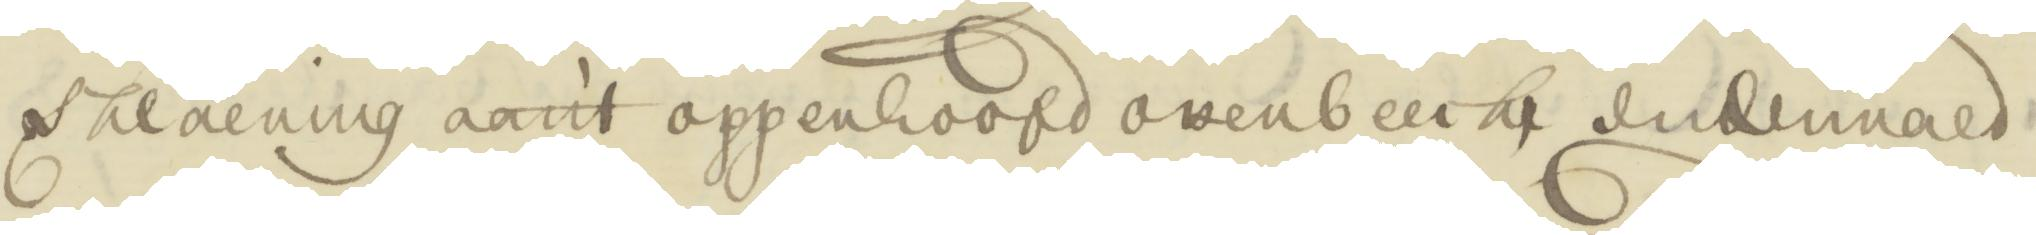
verklaering aan’t opperhoofd overbeeck en den raed
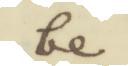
be
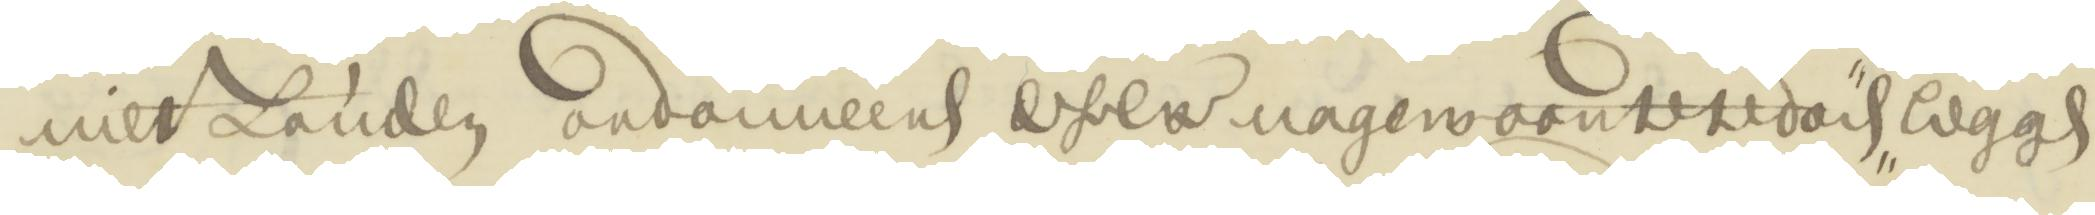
niet Zouden ordonneeren deselve nagewoonte te doen „leggen
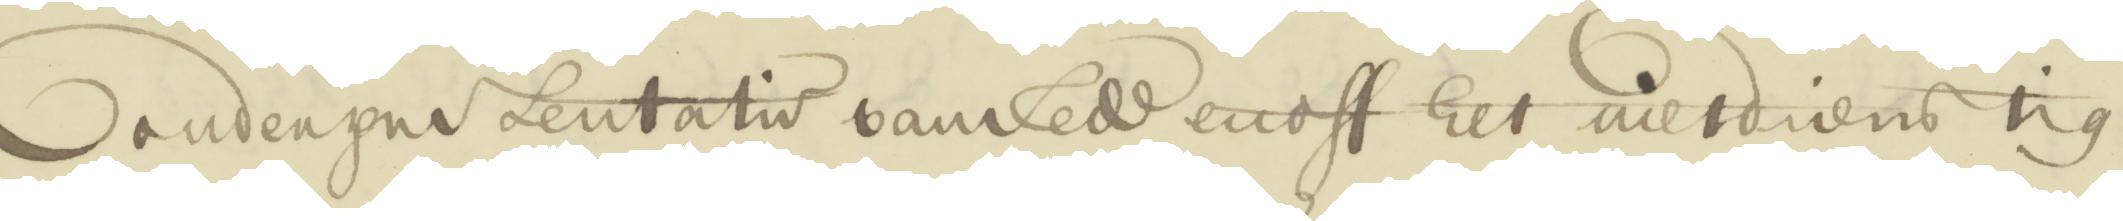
onder presentatie van Eede en off het met dienstig
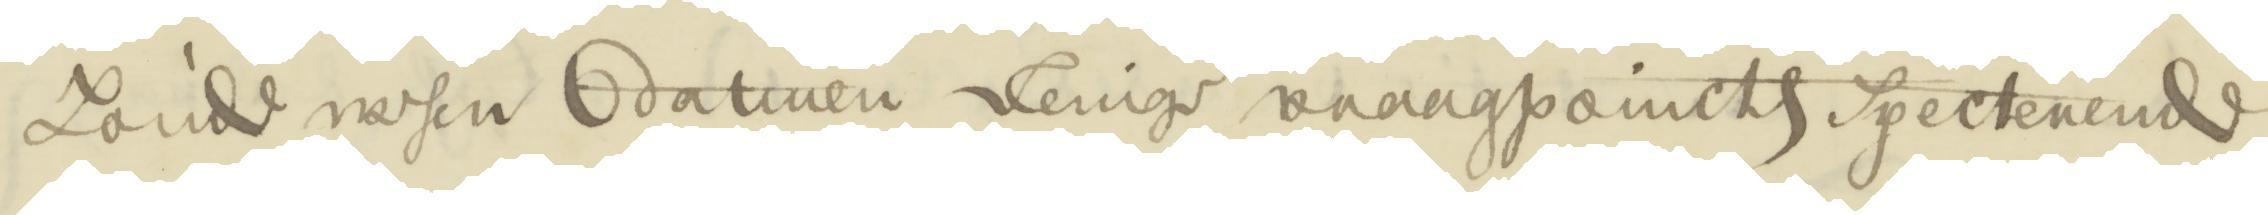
Zoude wesen dat men Eenige vraagpoincten Specterende
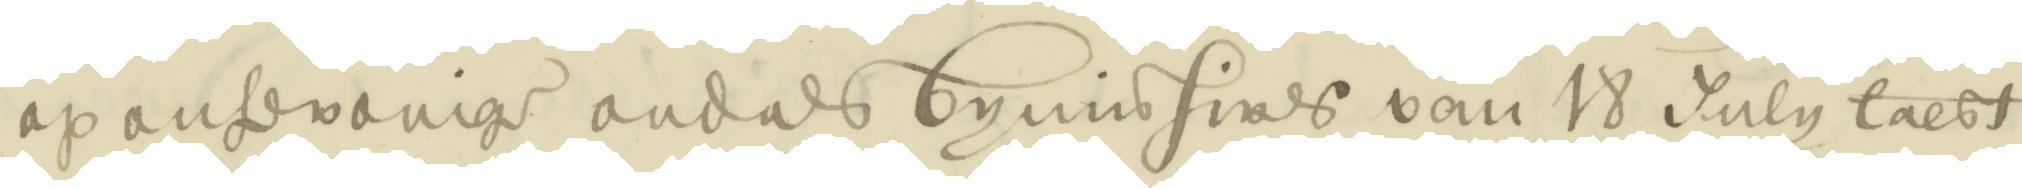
op onse vorige ordres by missives van 18 Iuly laest
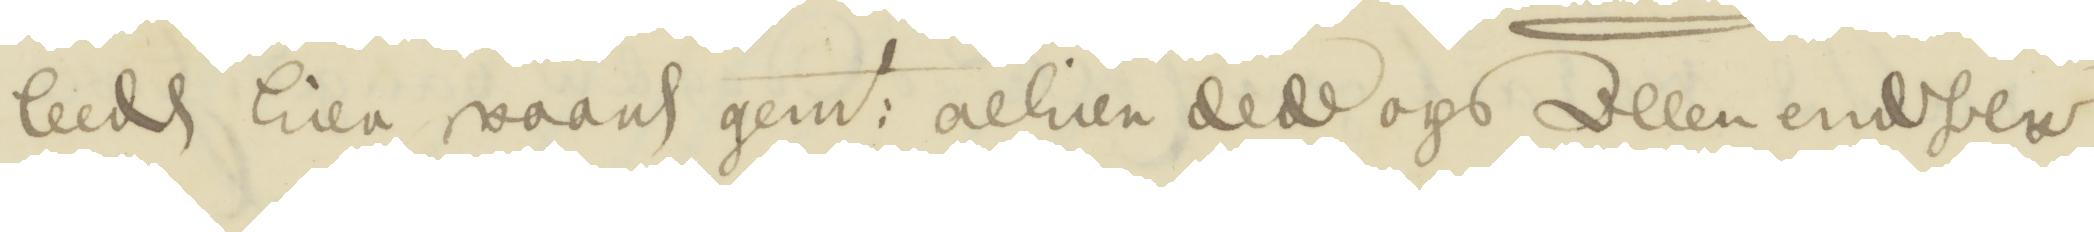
leeden hier vooren gem:t alhier dede opstellen en deselve
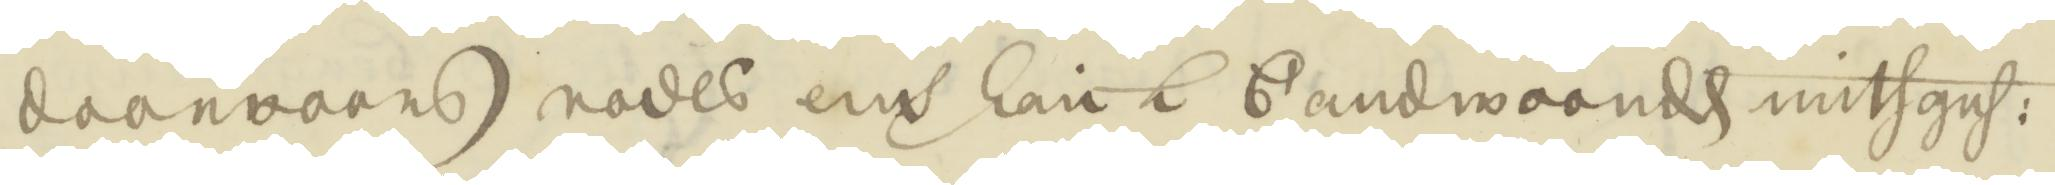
door voors roels en verhaick b'andwoorden mitsgrs:
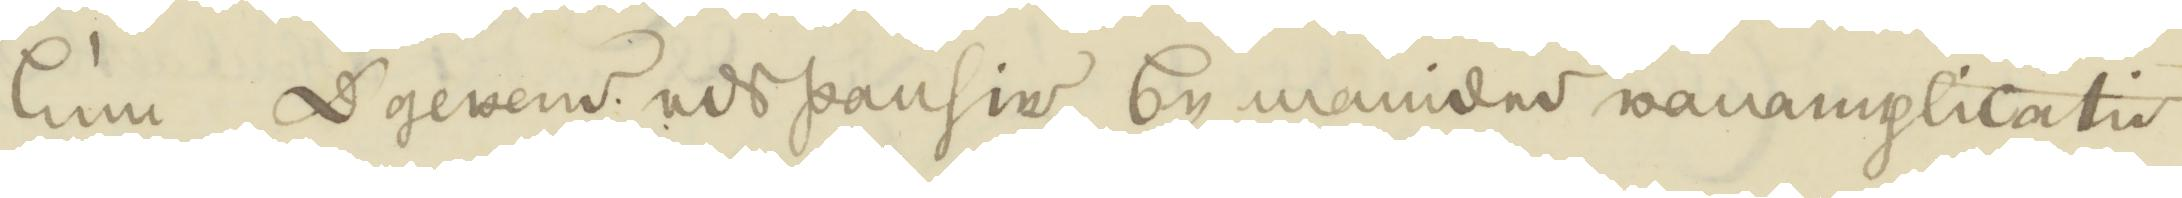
hun te gevene responsive by maniere vanamplicatie
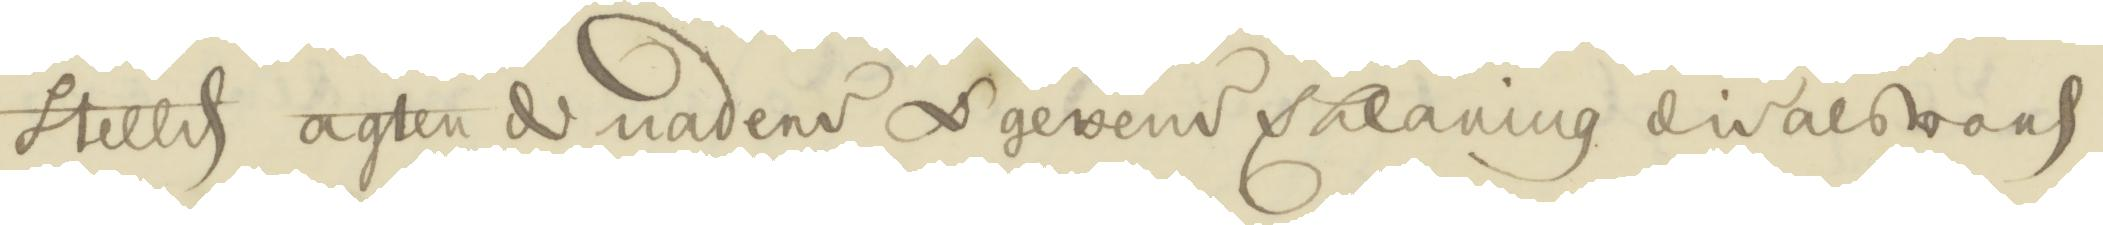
stellen agter de nadere te gevene verklaring die als voren
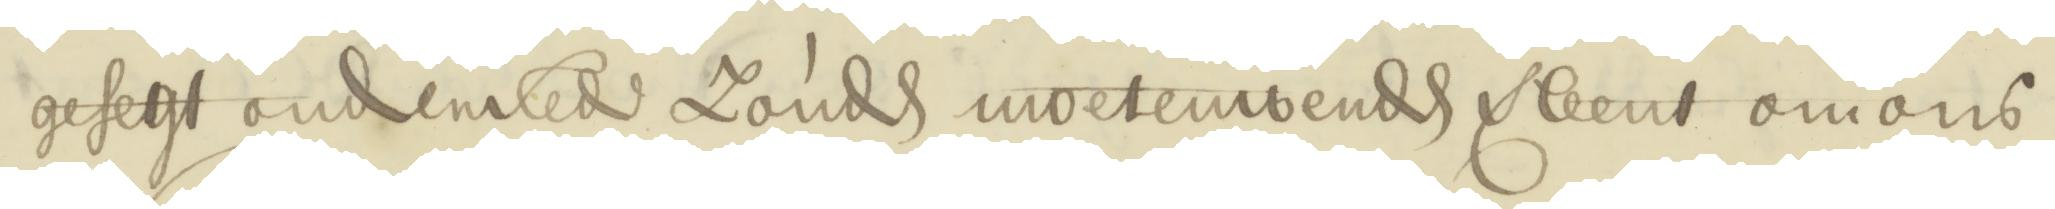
gesegt onder Eede Zouden moeten werden verleent om ons
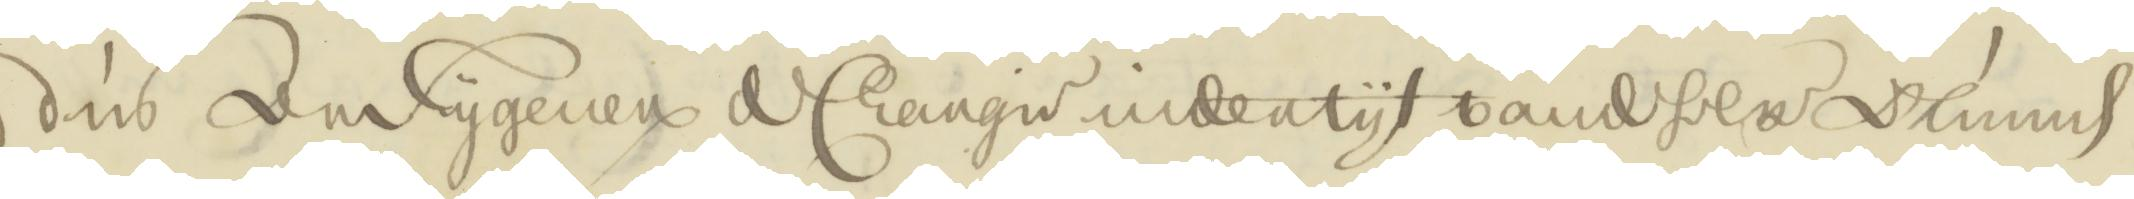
dus ter Eijgener dechargie indertijt van deselve te kunnen
